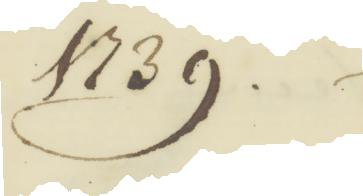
1739.
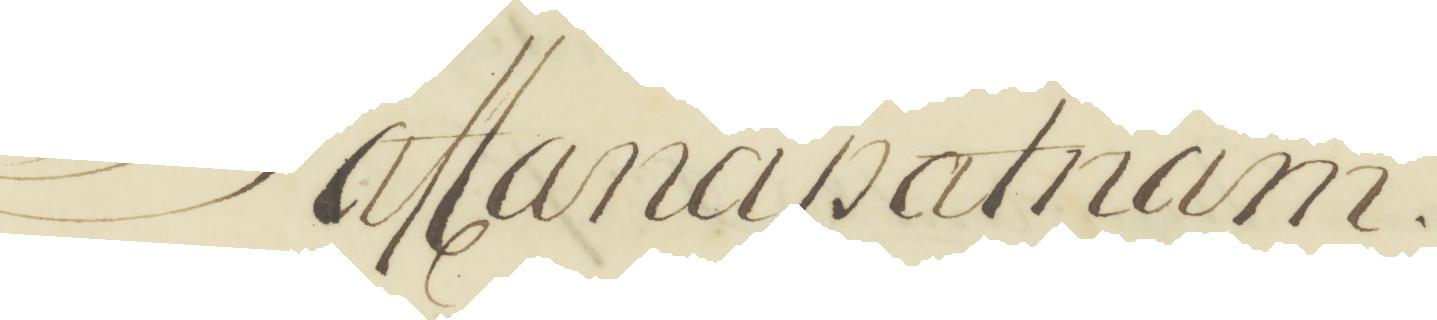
Jaffanapatnam.
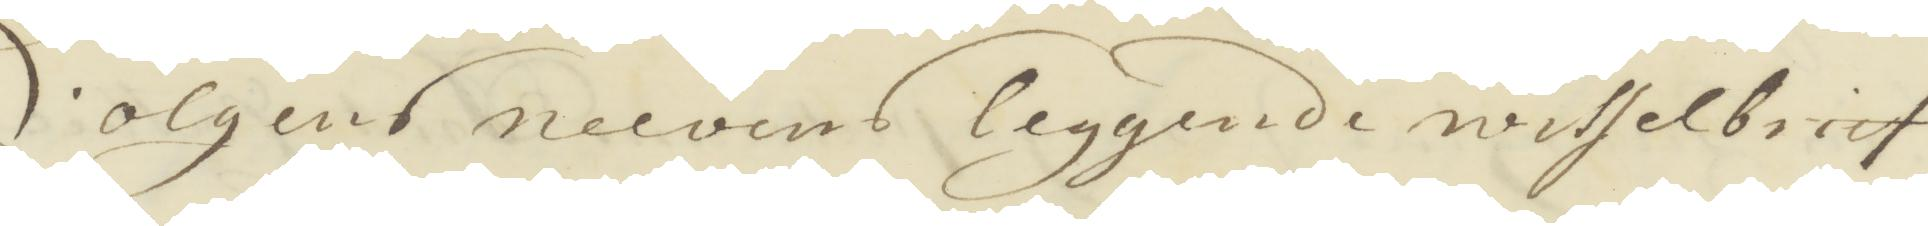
Volgens neevens leggende wisselbrief
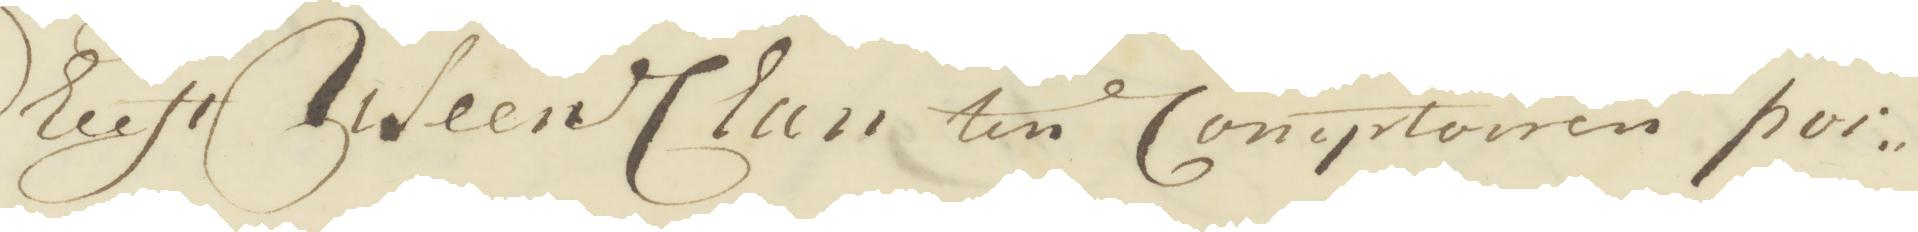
heeft Useen Chan ten Comptoiren por„
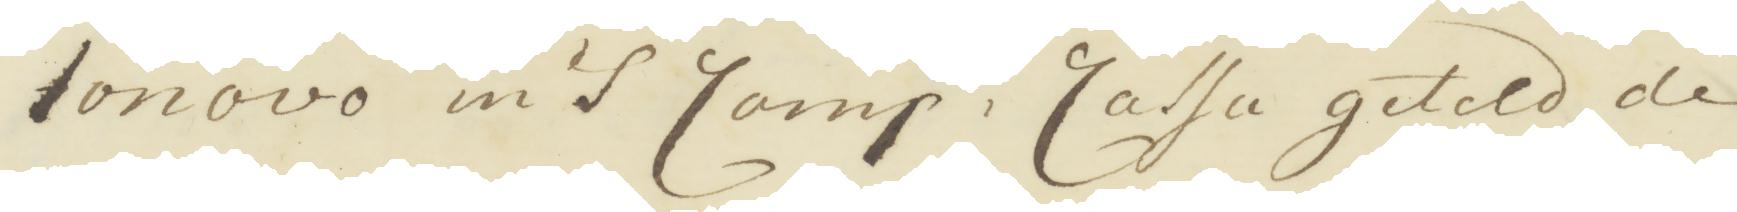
tonovo in ’S Comp: Cassa geteld de
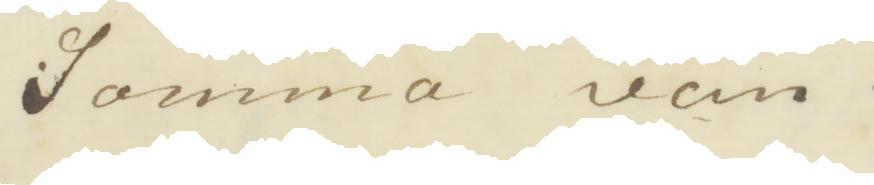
Somma van.
